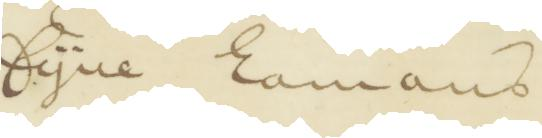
fijne hamans
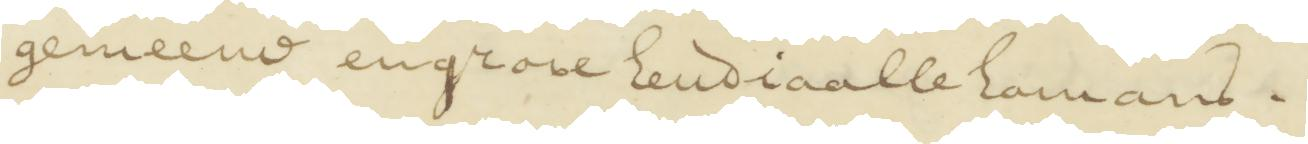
gemeene en grove hendiaalle hamans
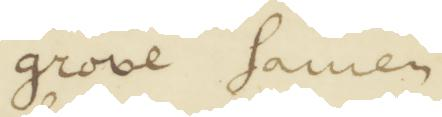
grove samen
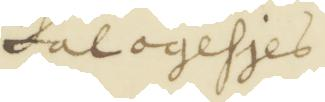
salogesjes
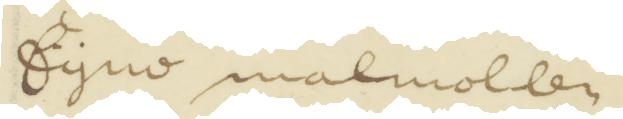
fijne malmollen
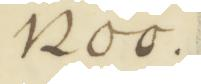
1200.
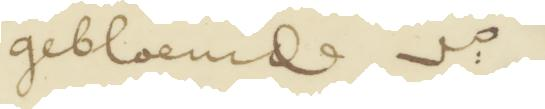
gebloemde d:o
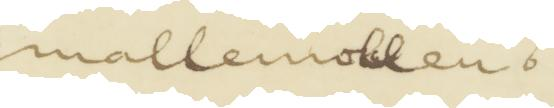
mallemollens
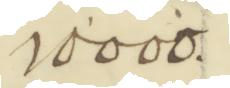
10000.
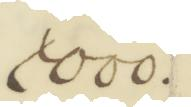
5000.
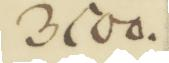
3500.
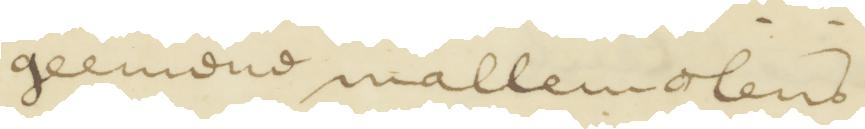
geemene mallemolens
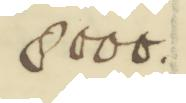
8000.
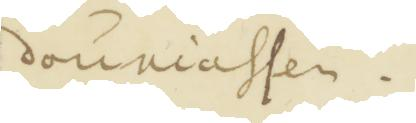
douriassen
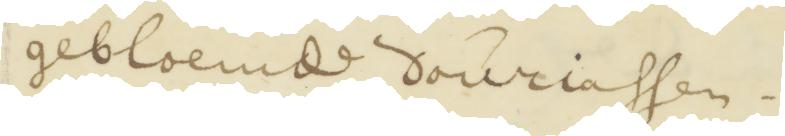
gebloemde douriassen
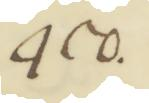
450.
